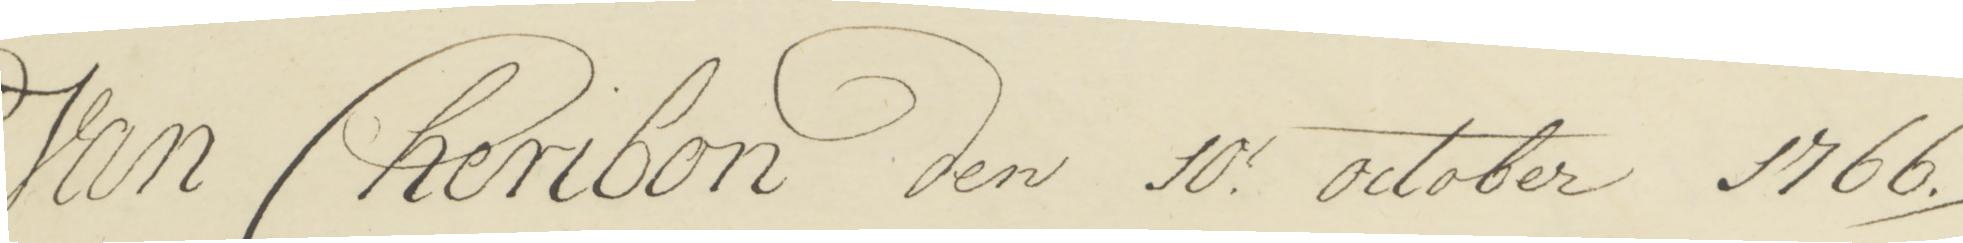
Van Cheribon den 10.' october 1766.
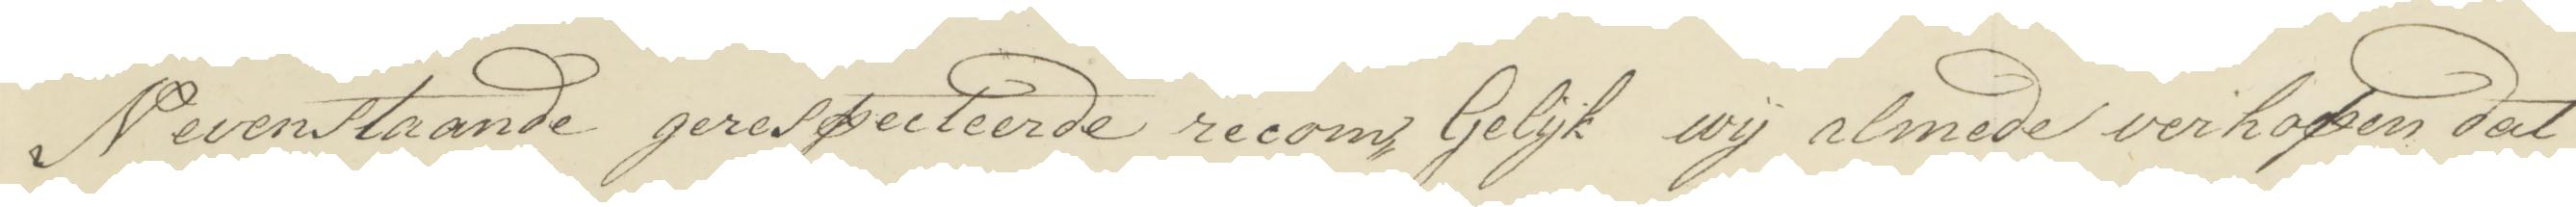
Nevenstaande gerespecteerde recom„ Gelijk wij almede verhopen dat
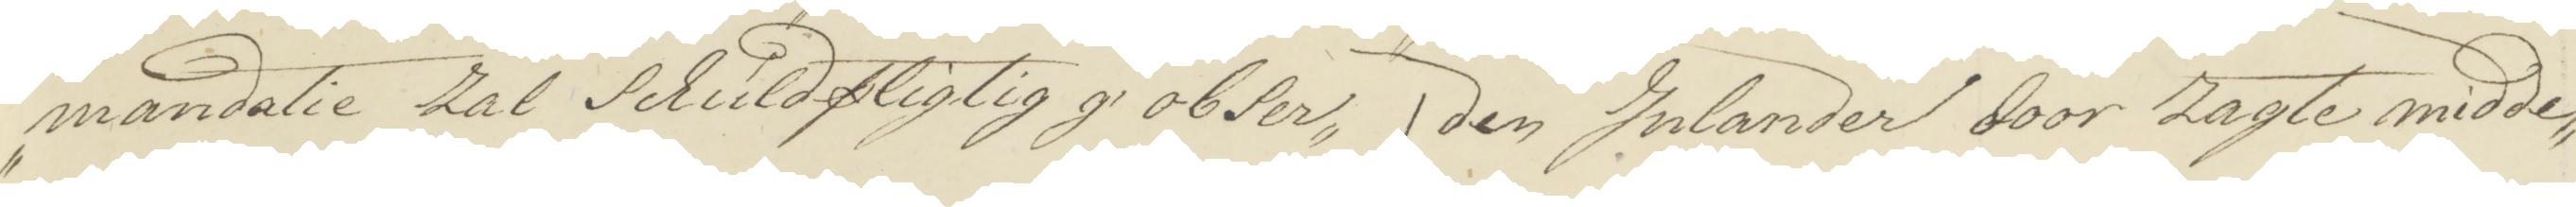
„mandatie zal schuldpligtig g’obser„ den Jnlander door zagte midde„
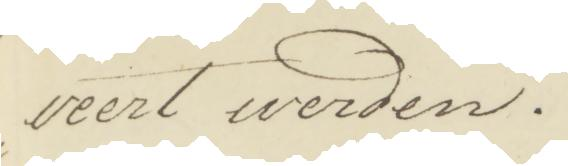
veert werden.
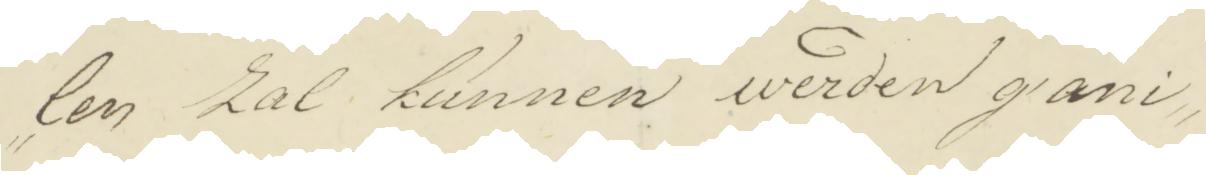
„len zal kunnen werden g'ani„
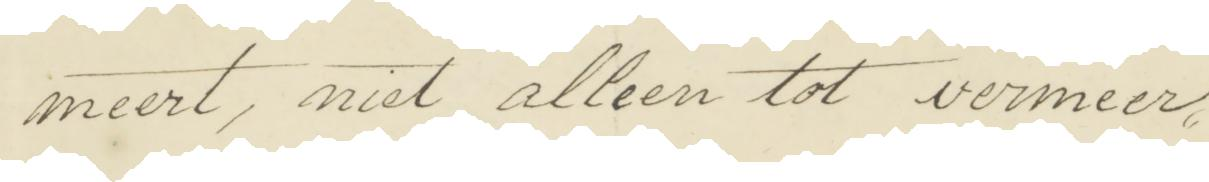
meert, niet alleen tot vermeer„
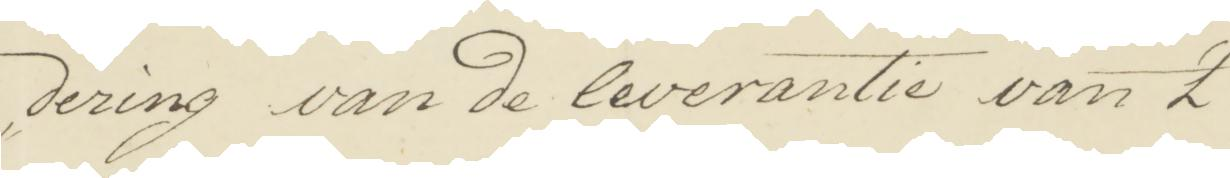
„dering van de leverantie van ’t
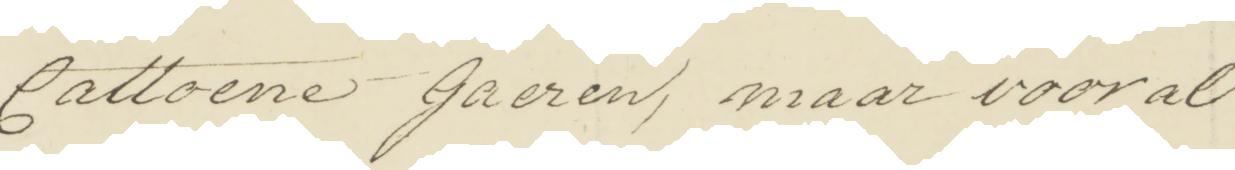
Cattoene Gaeren, maar voor al
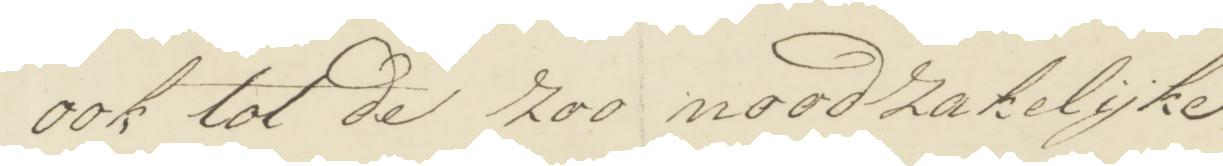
ook tot de zoo noodzakelijke
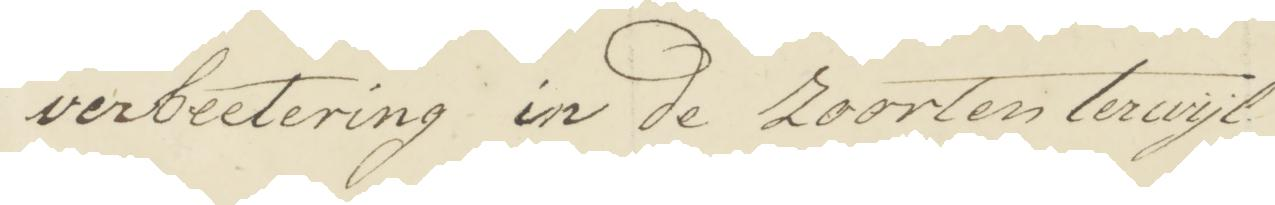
verbeetering in de zoorten terwijl
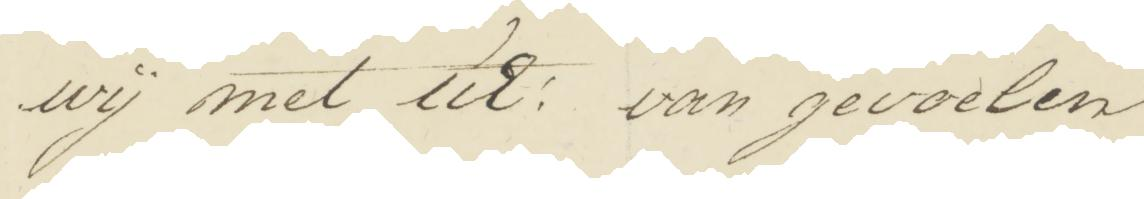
wij met uE: van gevoelen
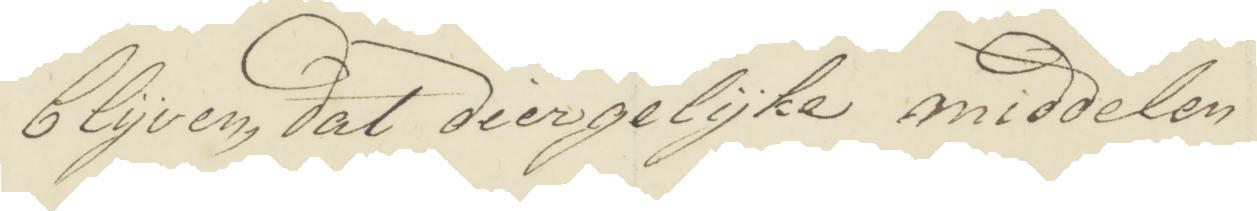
blijven, dat diergelijke middelen
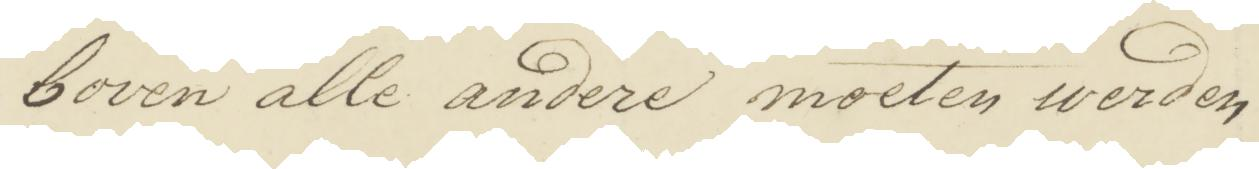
boven alle andere moeten werden
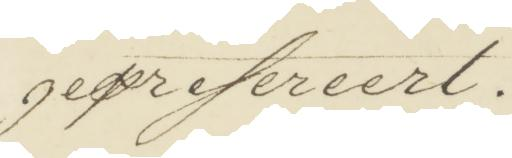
geprefereert.
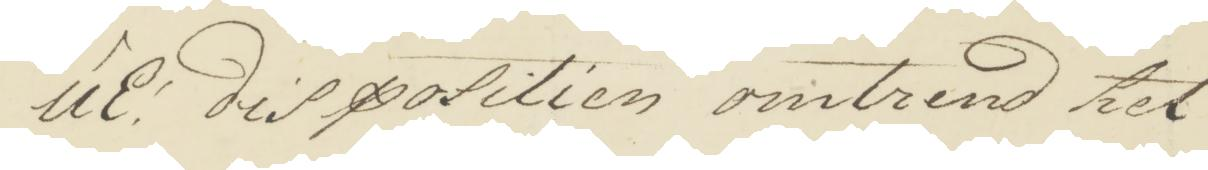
uE: dispositien omtrend het
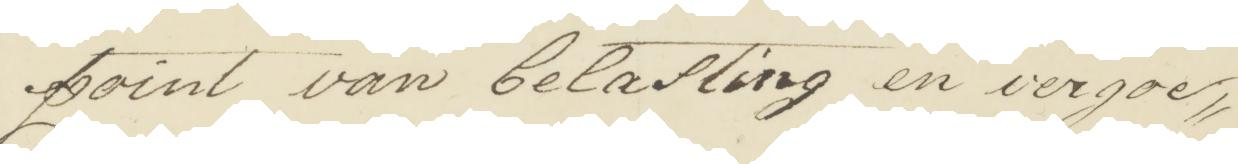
point van belasting en vergoe„
